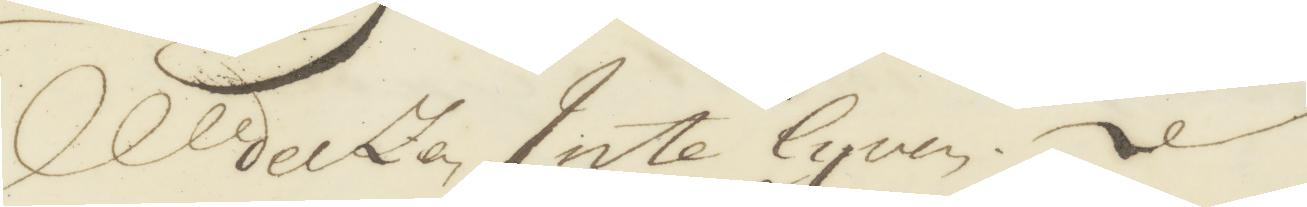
deezen Jnte lyven.
